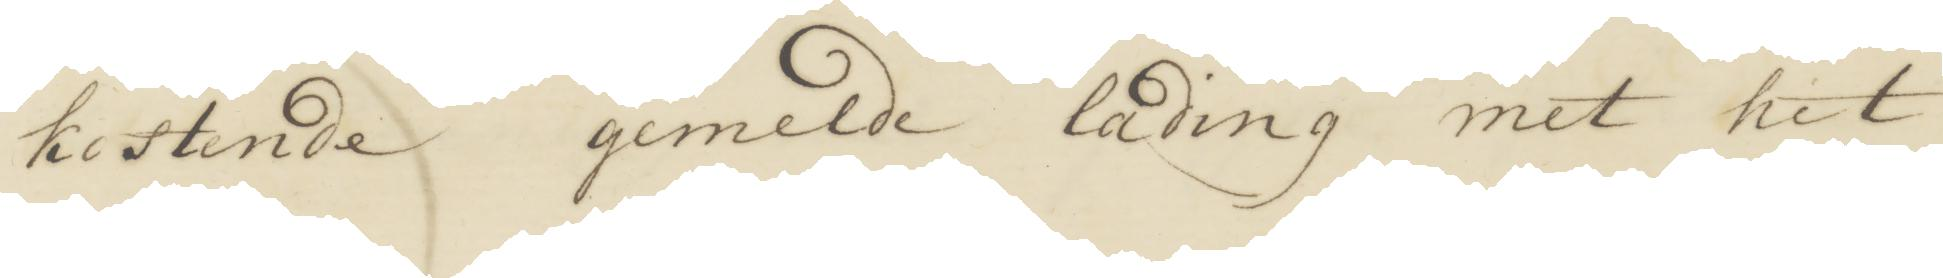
kostende gemelde lading met het
